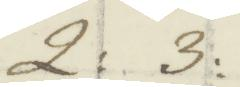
2: 3:
